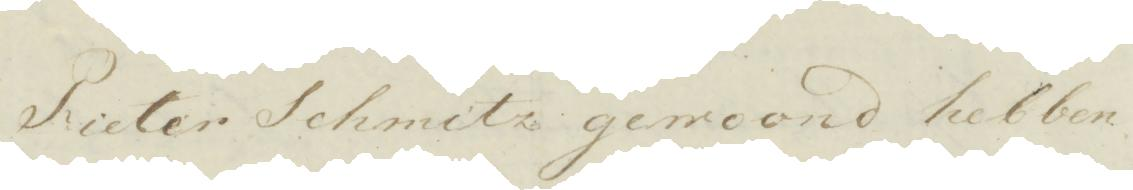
Pieter Schmitz gewoond hebben.
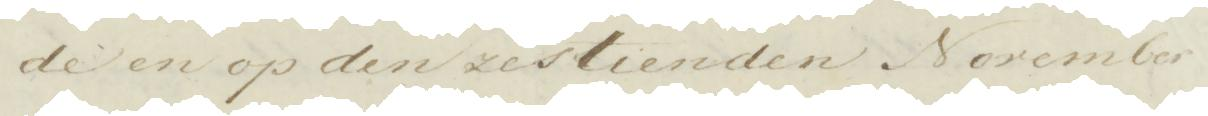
de en op den zestienden November
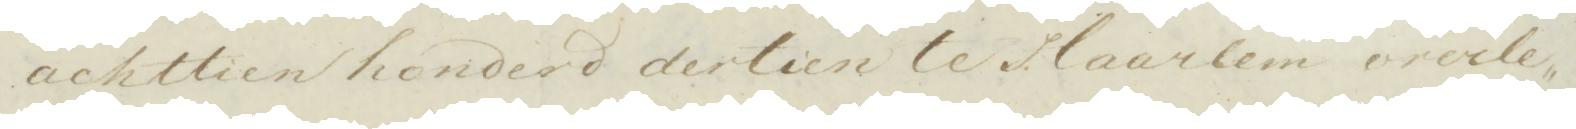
achttien honderd dertien te Haarlem overle„
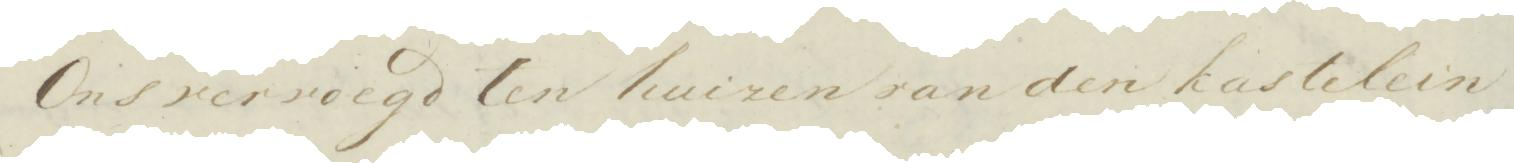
Ons vervoegd ten huizen van den kastelein
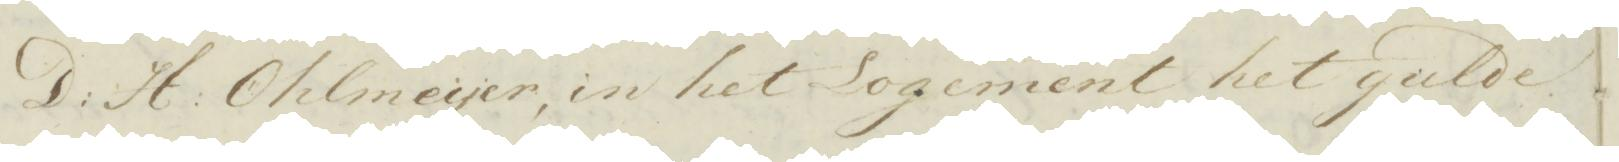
D: H: Ohlmeijer, in het Logement het gulde
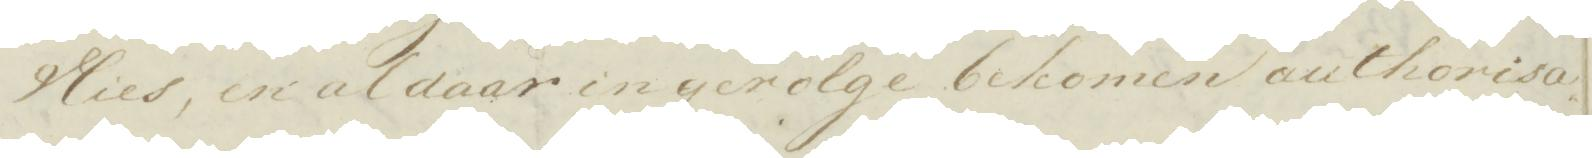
Vlies, en aldaar in gevolge bekomen authorisa„
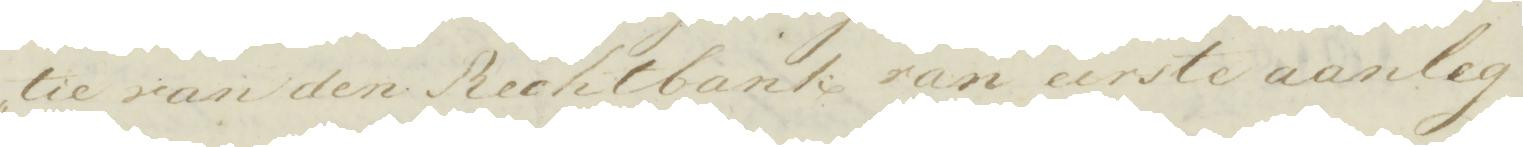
tie van den Rechtbank van eerste aanleg
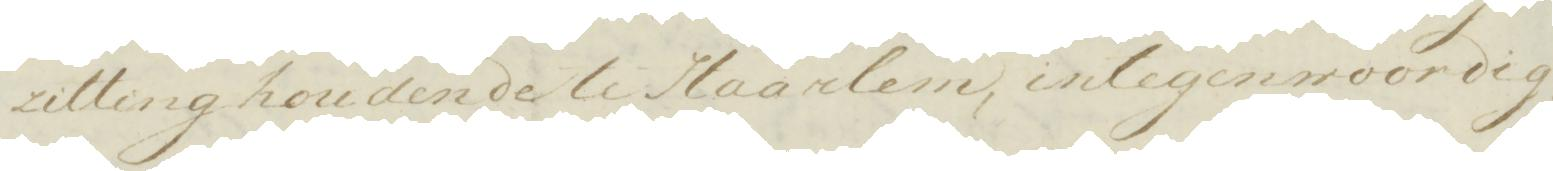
zitting houdende te Haarlem, in tegenwoordig
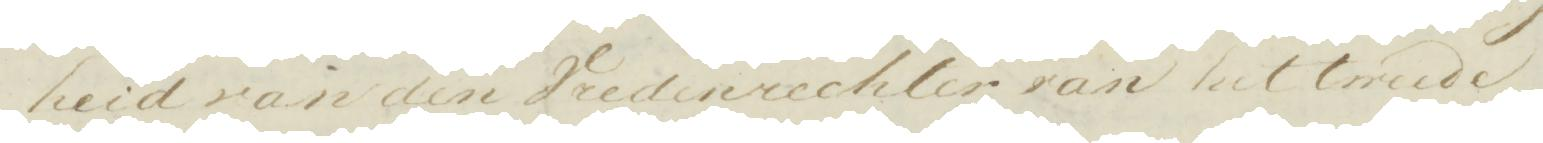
heid van den Vredenrechter van het tweede
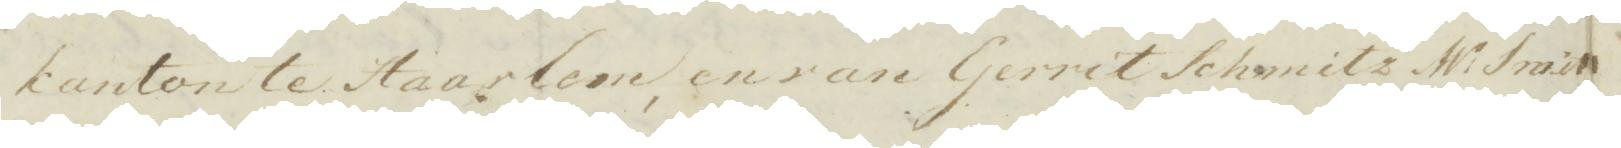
kanton te Haarlem, en van Gerrit Schmitz M:r Smit
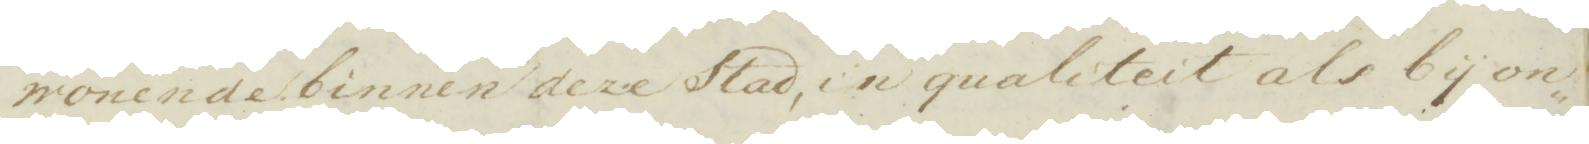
wonende binnen deze stad, in qualiteit als bij on„
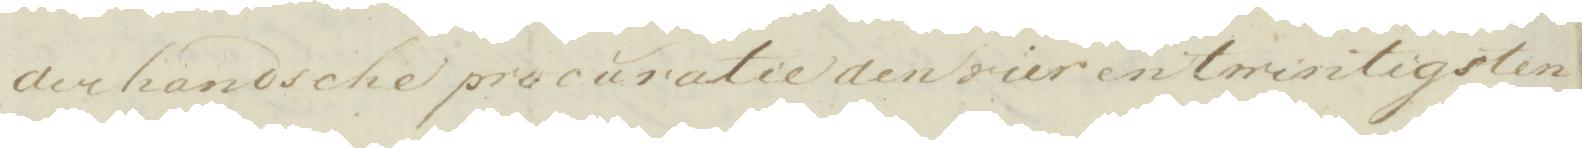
derhandsche procuratie den vier en twintigsten
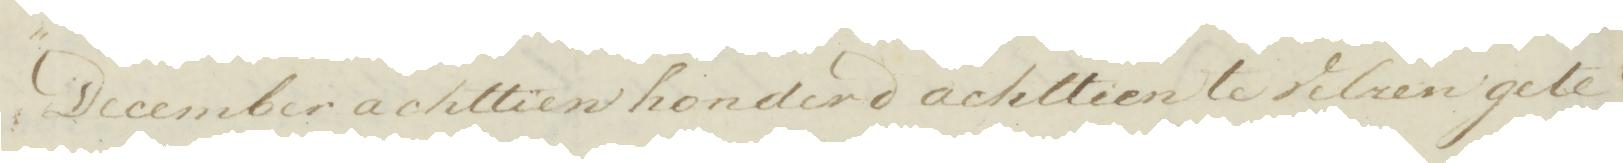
December achttien honderd achttien te velzen gete
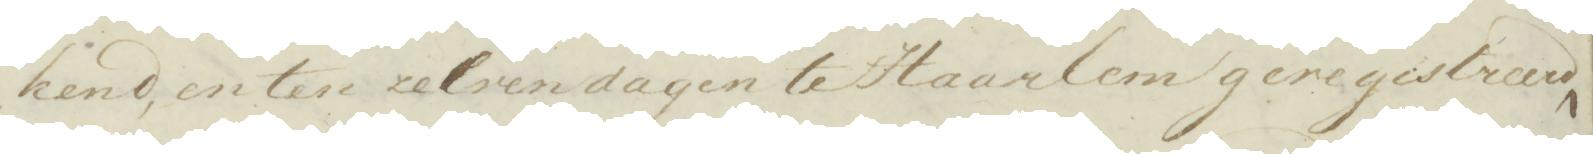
kend, en ten zelven dagen te Haarlem geregistreerd„
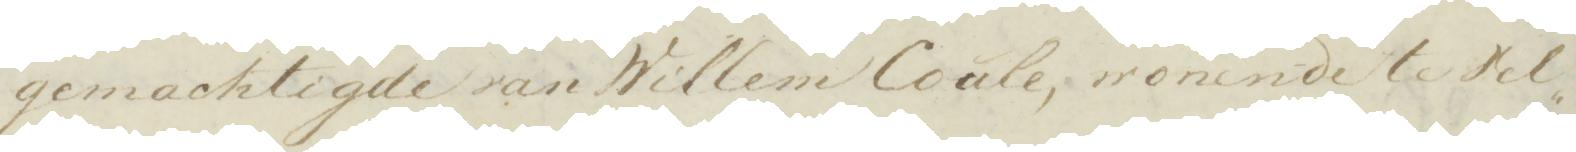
gemachtigde van Willem Coule, wonende te Vel„
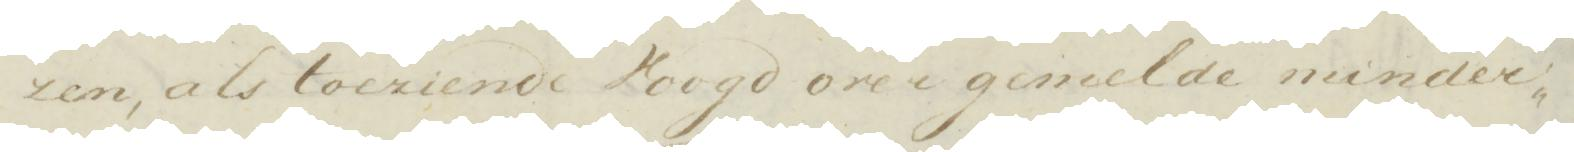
zen, als toeziende Voogd over gemelde minder„
